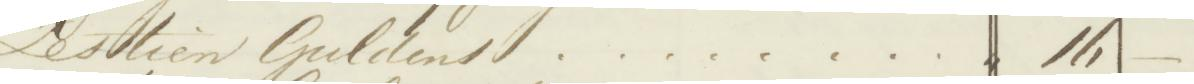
Zestien Guldens . . . . . . . . „ 16 —
